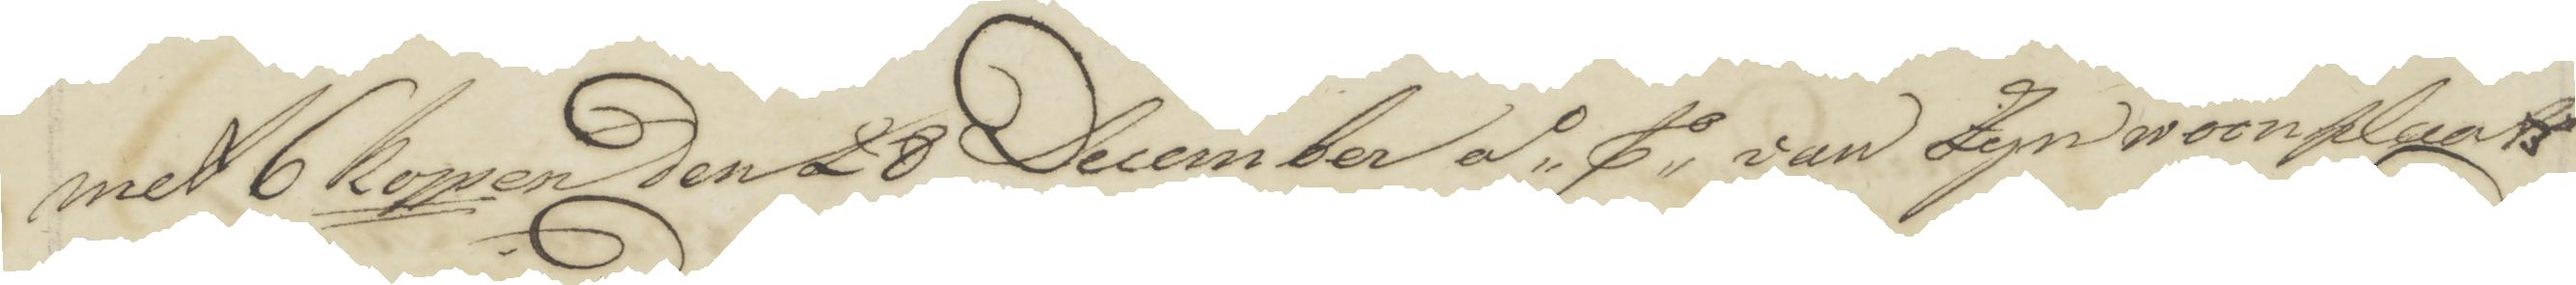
met 6 koppen den 28 December a„o p„s van Zyn woonplaats
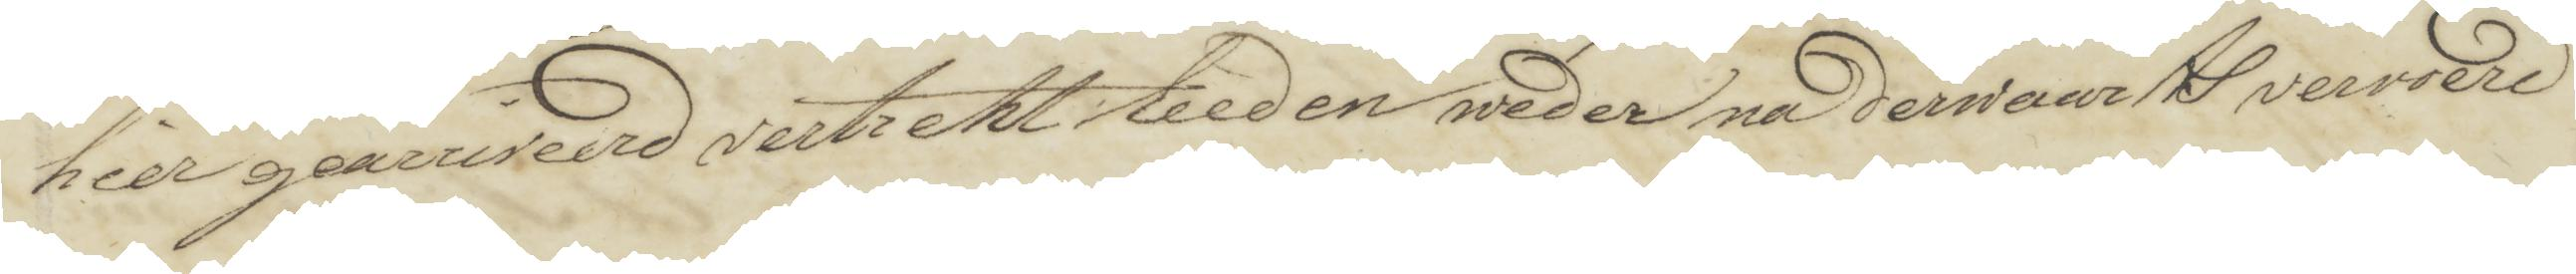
hier gearriveerd vertrekt heeden weder na derwaarts vervoerd
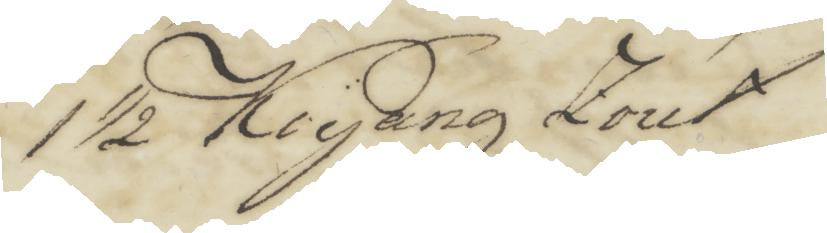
1½ Koijang Zout
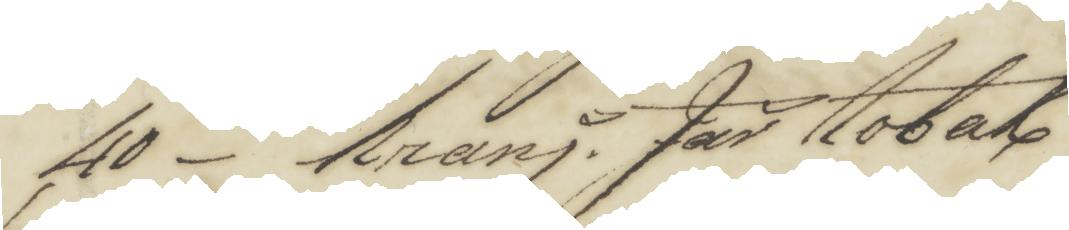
40 — kranj.s Javs tobak
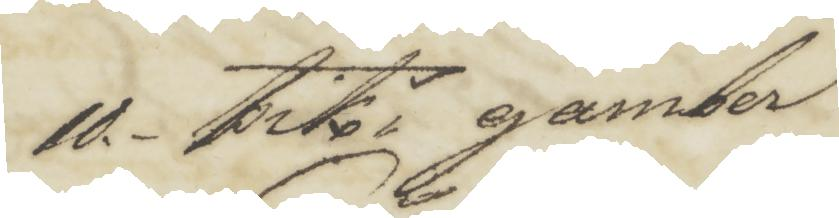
10.— pik„s gamber
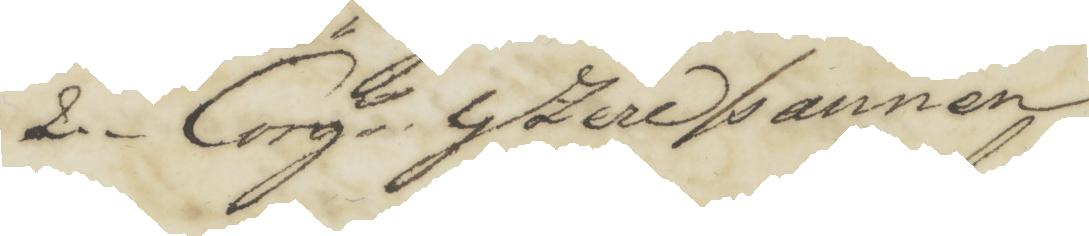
2.— Corg„s. yzere pannen
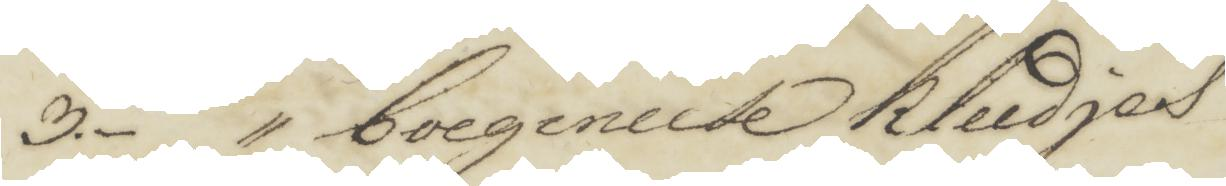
3.— „ boegineese kleedjes
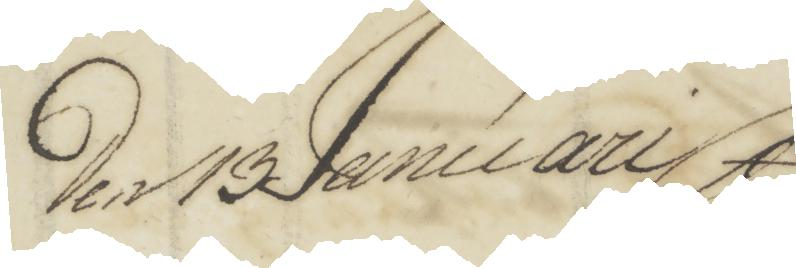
den 13 Ianuari
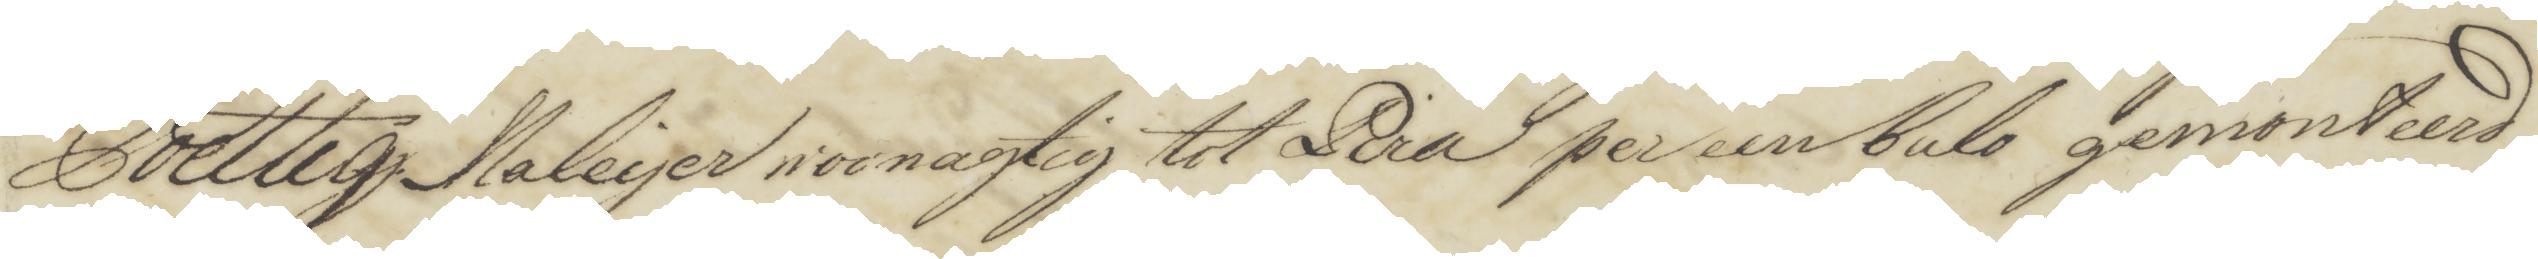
Poettig Maleijer woonagtig tot Pira per een balo gemonteerd
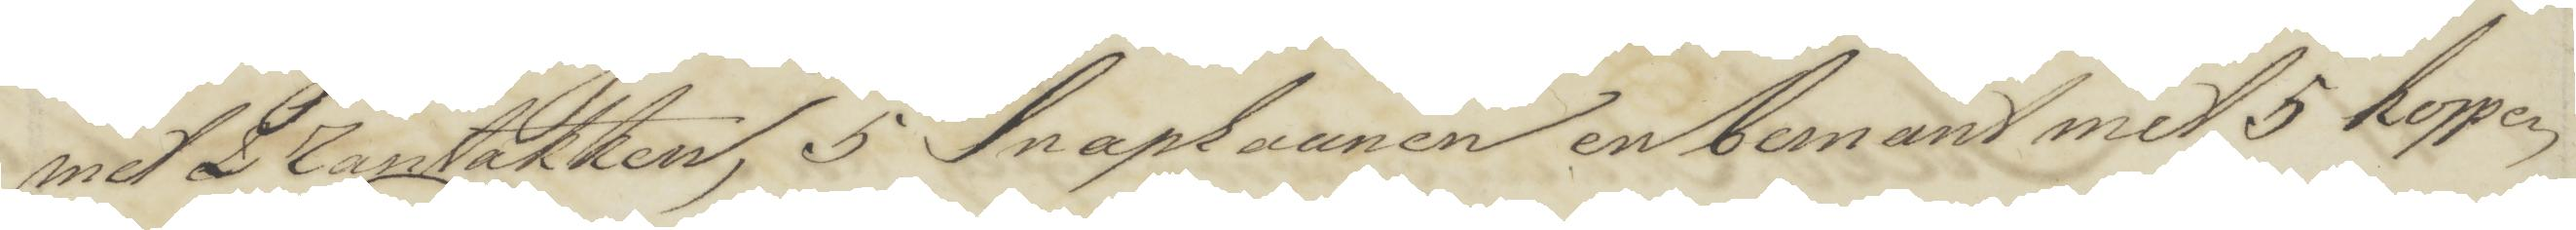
met 2 rantakken, 5 snaphaanen en bemant met 5 koppen
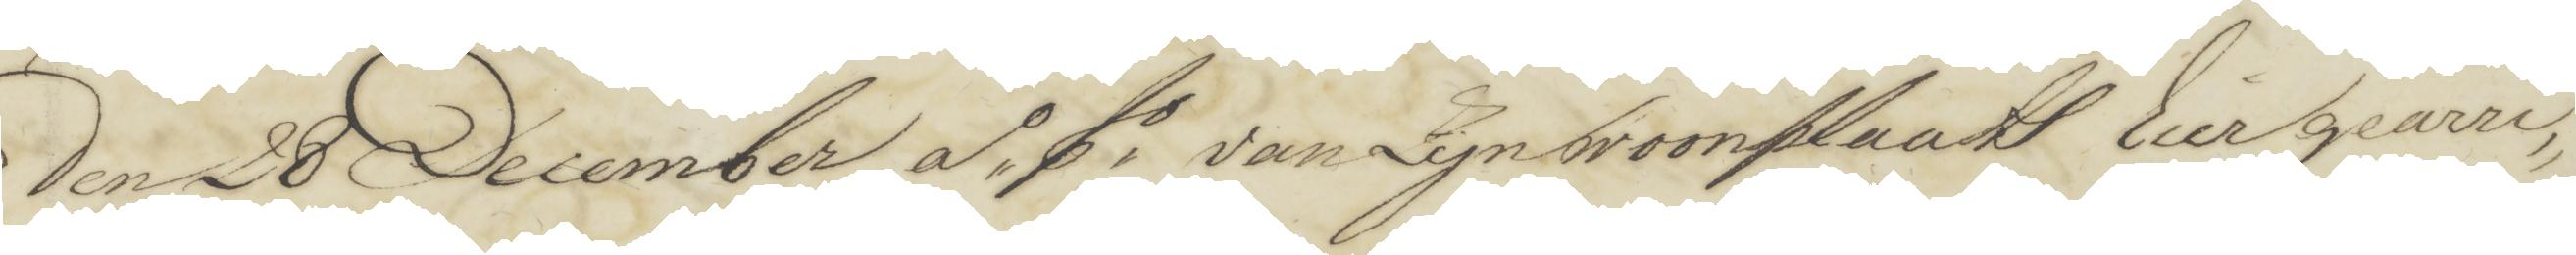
den 28 December a„o p„s van zijn woonplaats hier gearri„
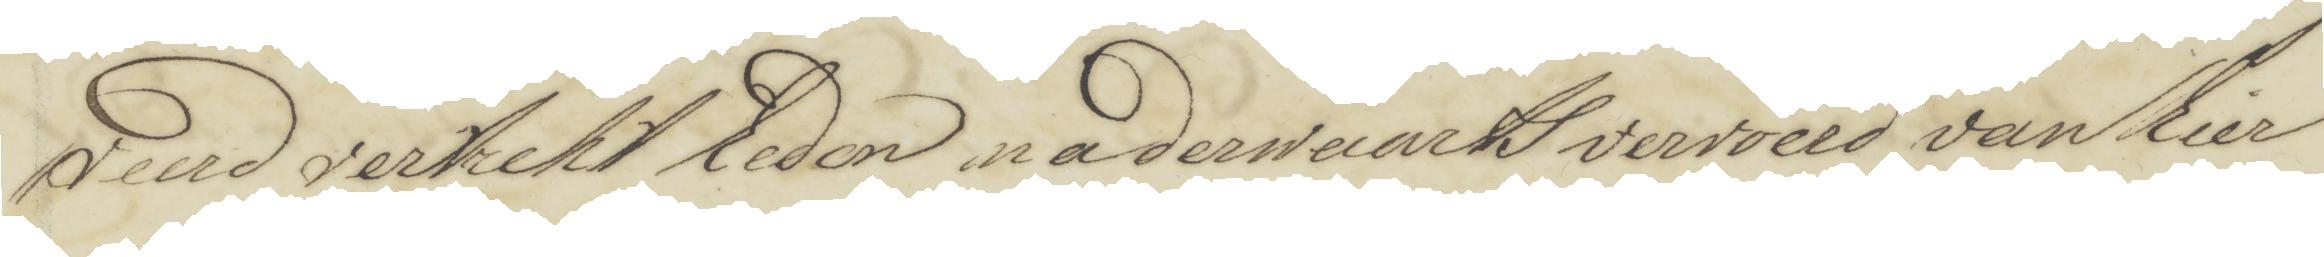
veerd vertrekt heden naderwaarts vervoerd van hier
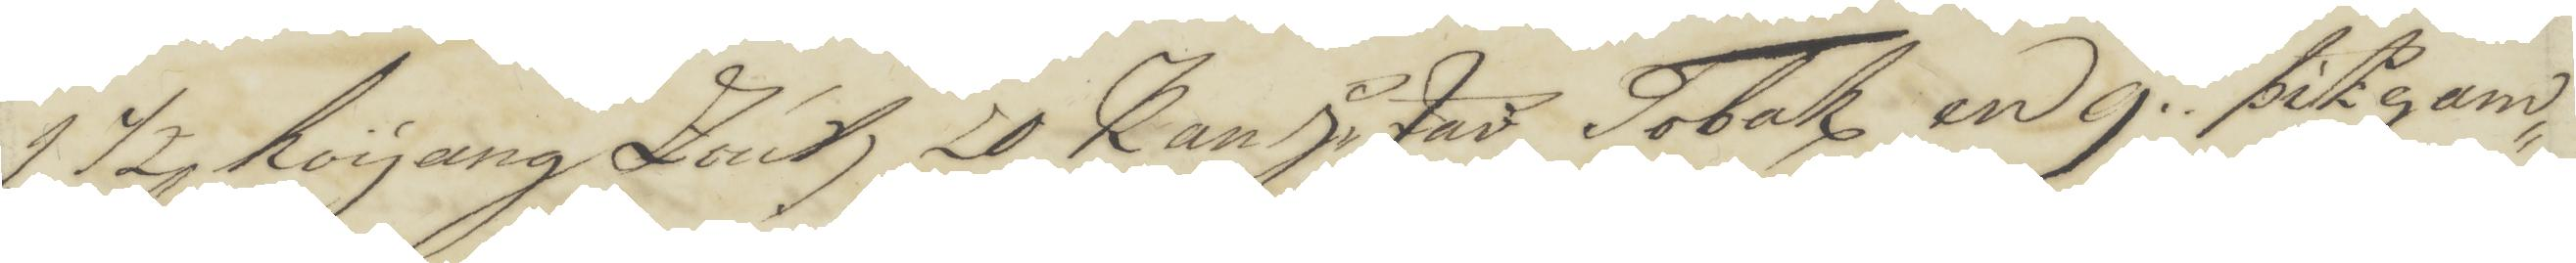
172 koijang Zout, 20 Kanj.o Javs Tobak en 9. piks gam„
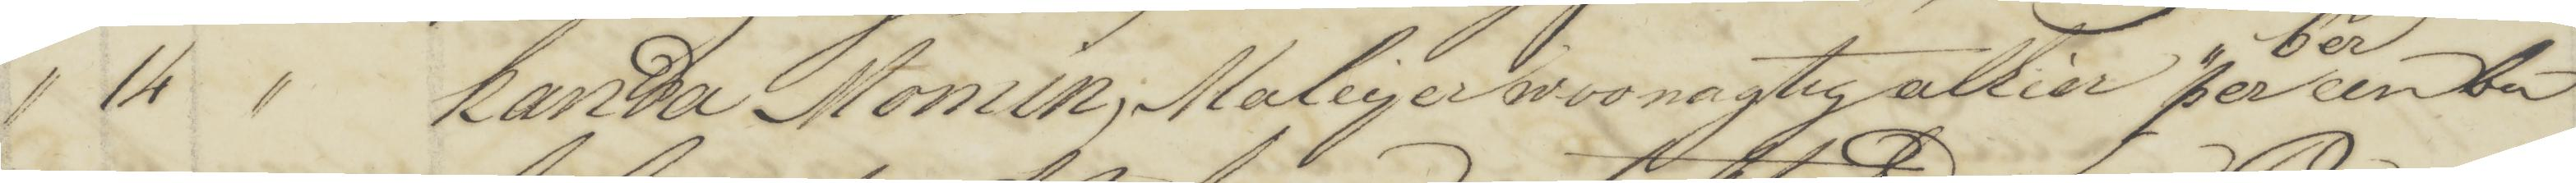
„ 14 „ kanda Momin, Maleijer woonagtig alhier per een ba
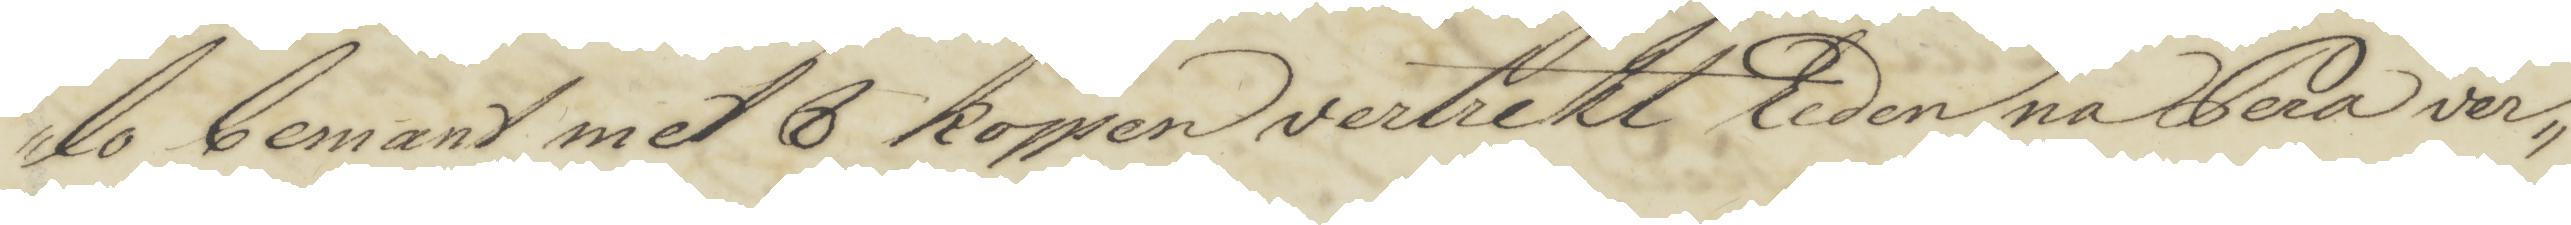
„lo bemant met 8 koppen vertrekt heden na Pera ver„
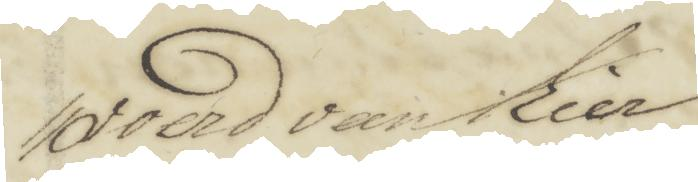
„voerd van hier
